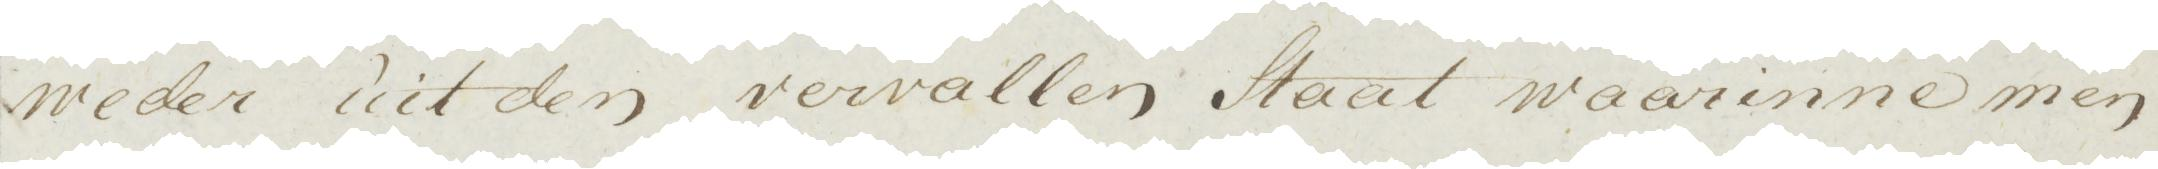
weder uit den vervallen staat waarinne men
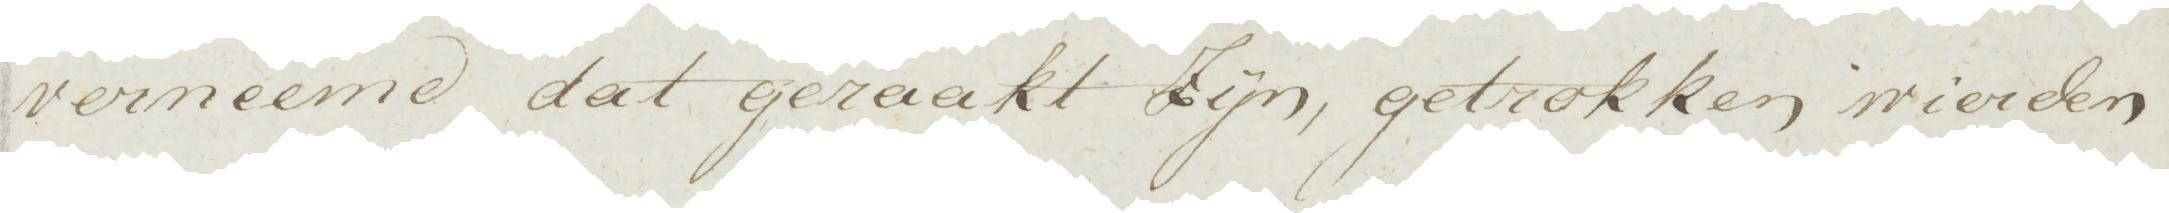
verneemd dat geraakt zijn, getrokken wierden
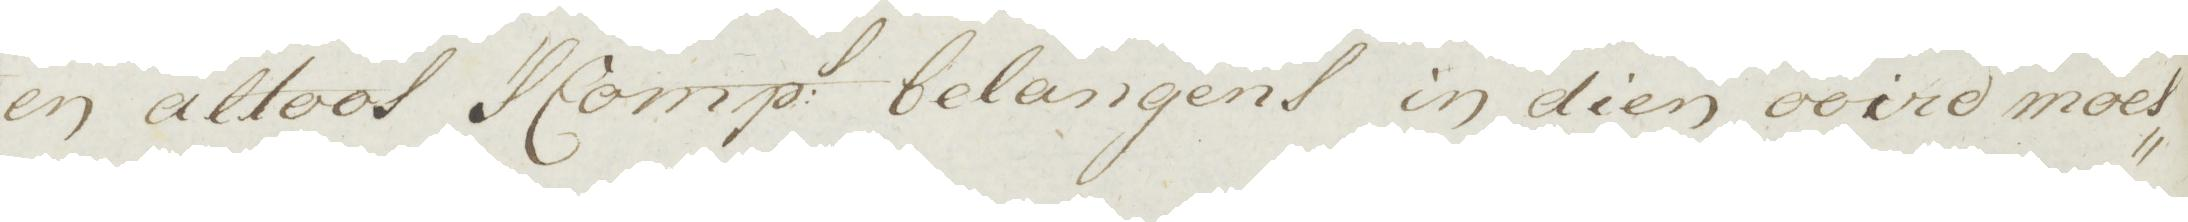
en altoos 's Comp:s belangens in dien ooird moes„
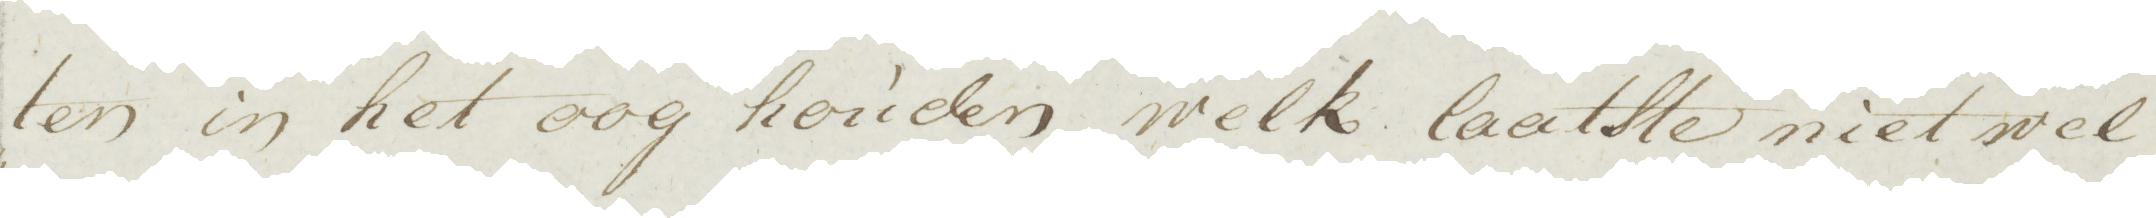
ten in het oog houden welk laatste niet wel
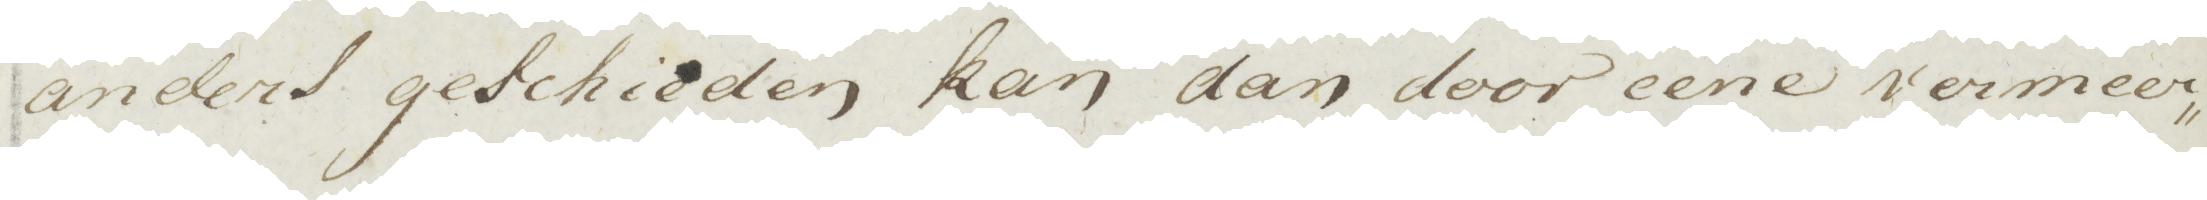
anders geschieden kan dan door eene vermeer„
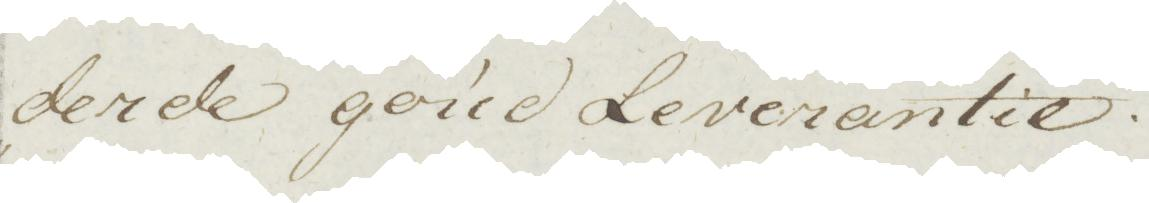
„derde goud Leverantie.
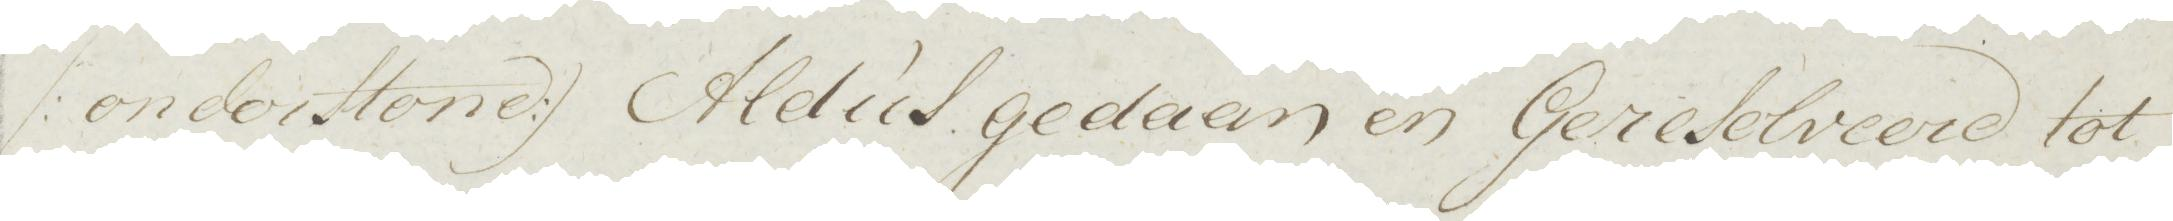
/:onderstond:) Aldus gedaan en Gereselveerd tot
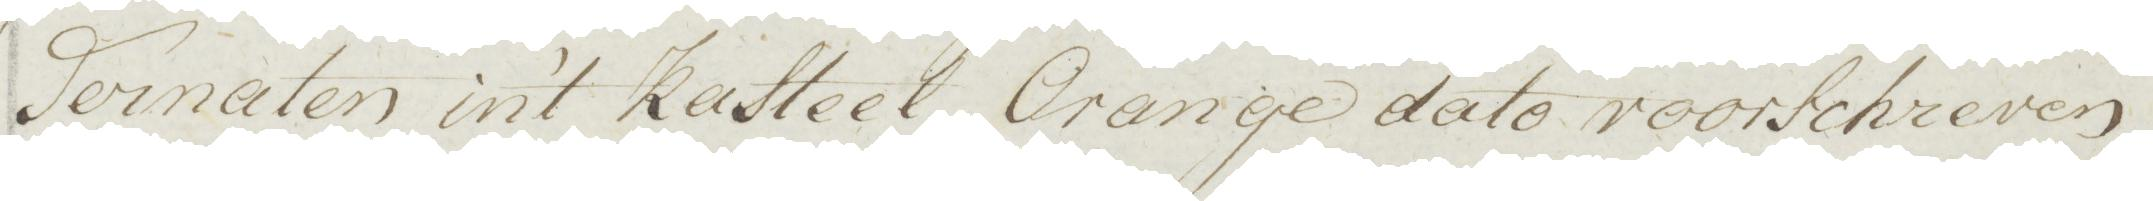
Ternaten in’t Kasteel Orange dato voorschreven
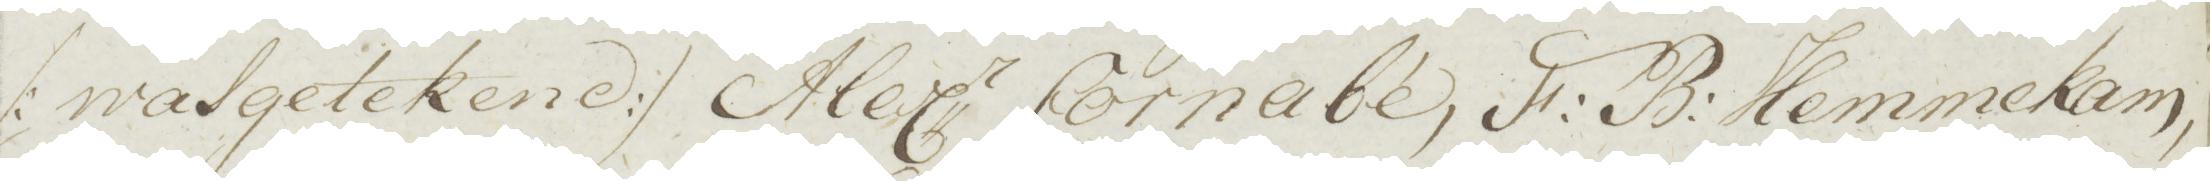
:was getekend:/ Alex„r Cornabé, F: B: Hemmekam,
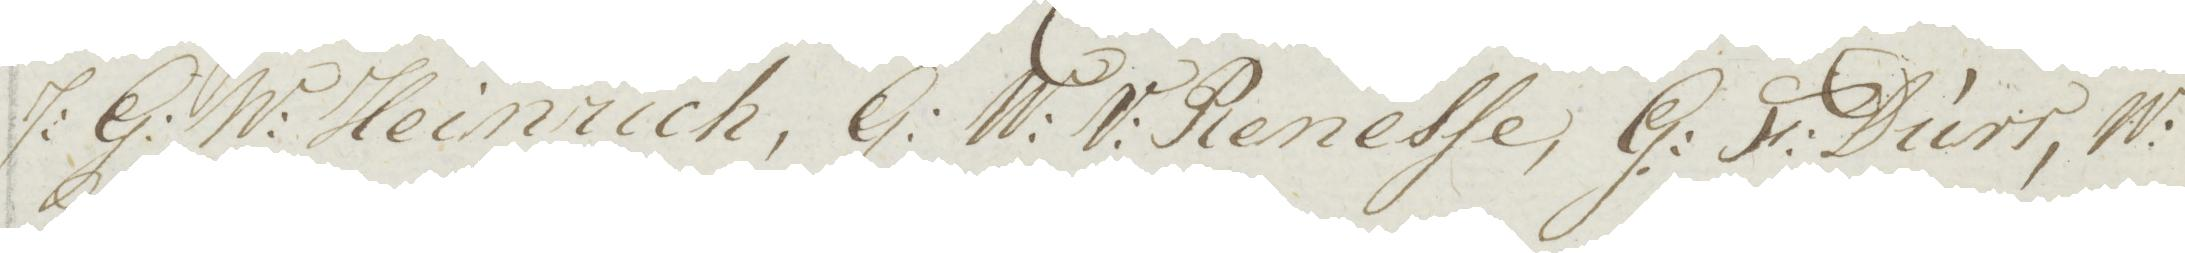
J: G: W: Heinrich, G: W: V: Renesse, G: F: Durr, W:
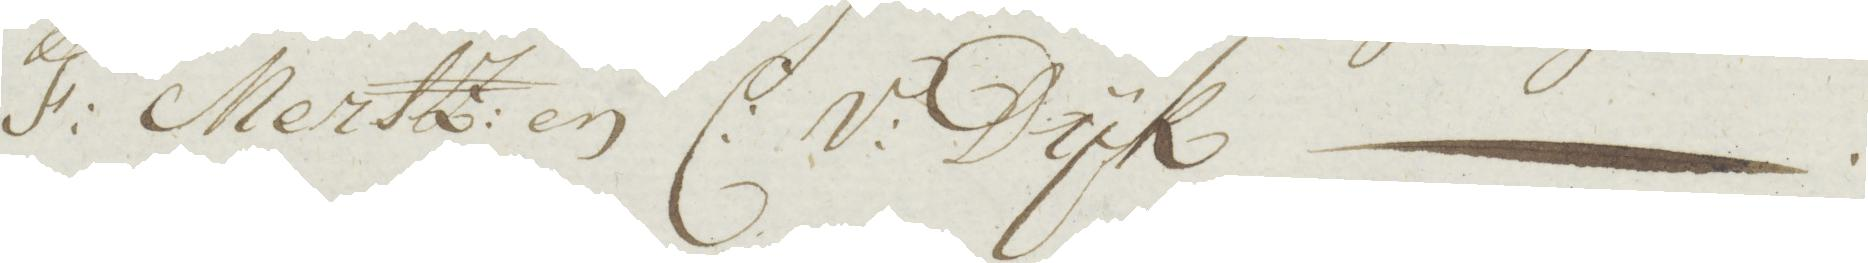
F: Mersz: en C: V: Dijk.
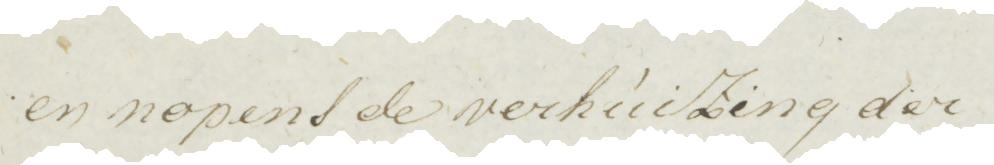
en nopens de verhuizing der
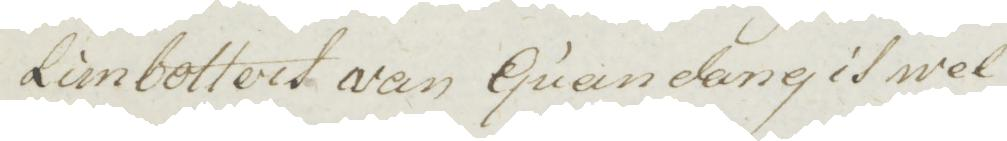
Limbotters van Quandang is wel
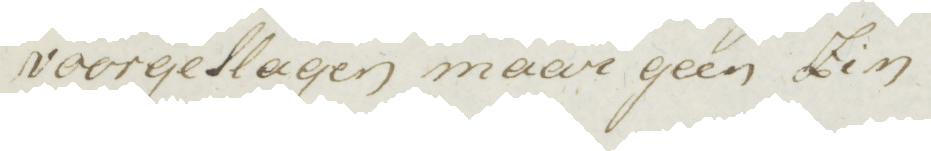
voorgeslagen maar geen zin
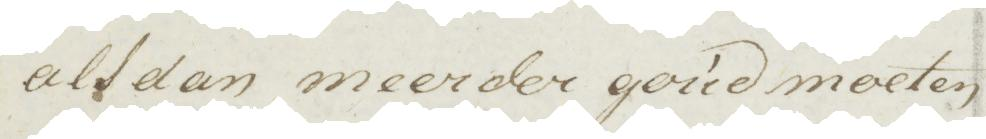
als dan meerder goud moeten
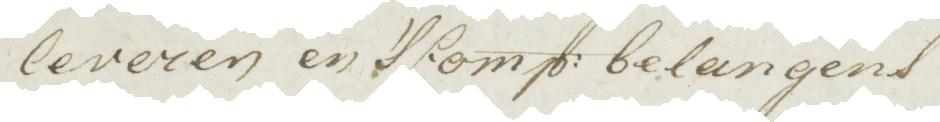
leveren en ’s Comp: belangens
